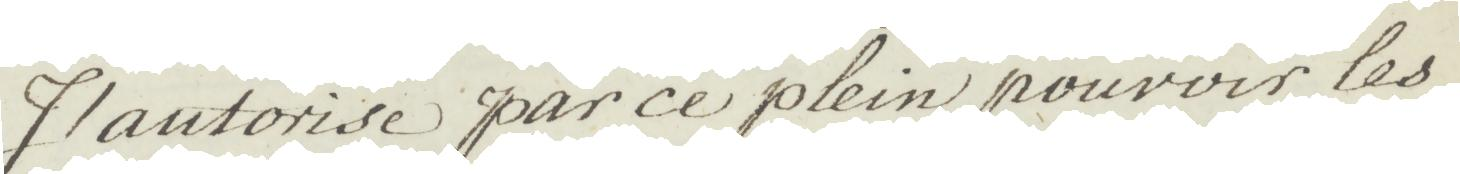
J'autorise par ce plein pouvoir les
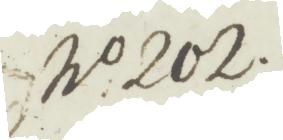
n:o 202.
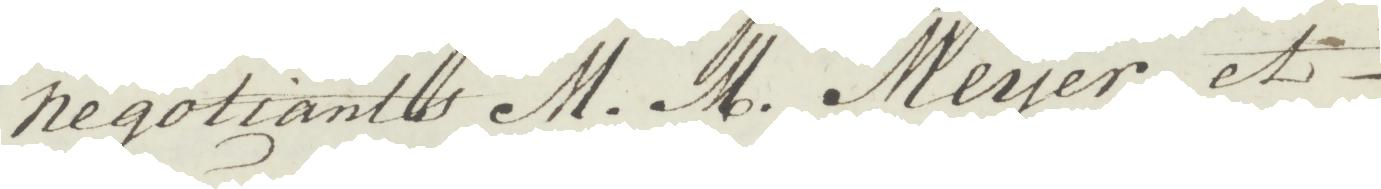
negotiants M.M. Meijer et
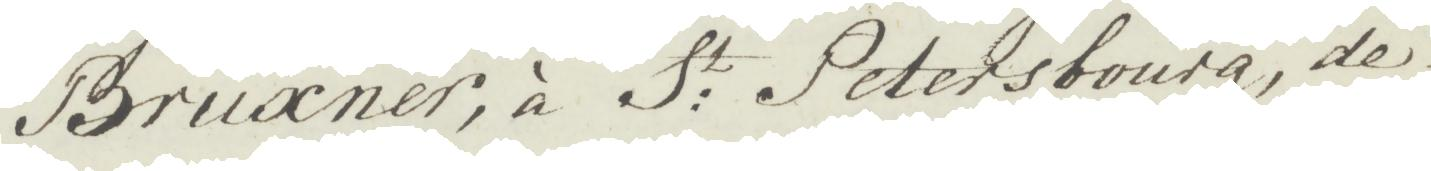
Bruxner, à S:t Petersbourg, de
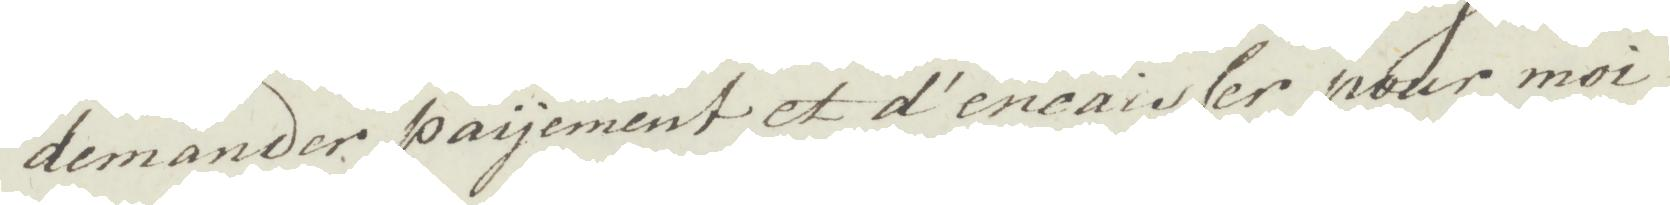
demander paijement et d’encaisser pour moi
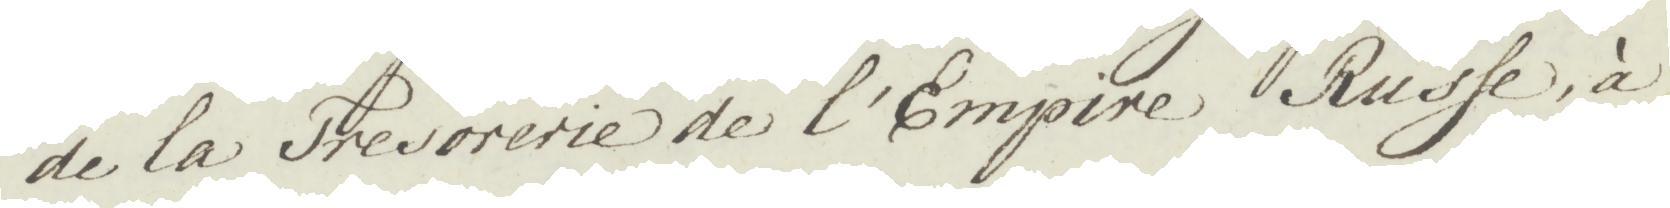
de la Tresorerie de L'Empire Russe, à
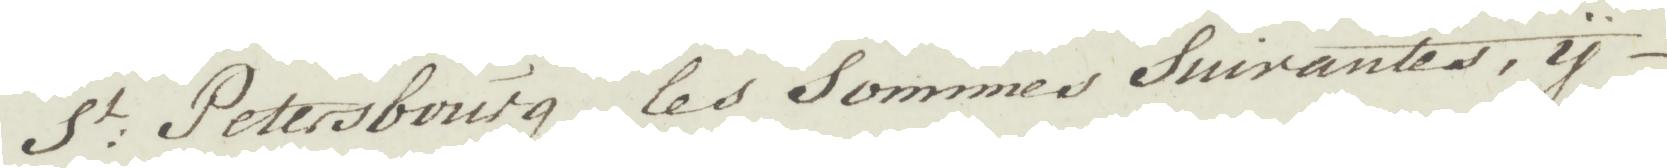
S:t Petersbourg les Sommes Suivantes, ij —
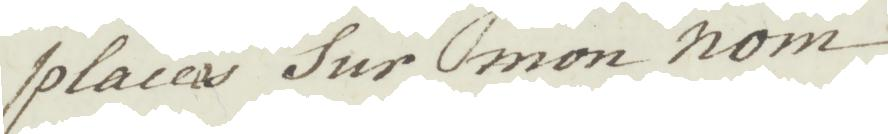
placeés sur mon nom
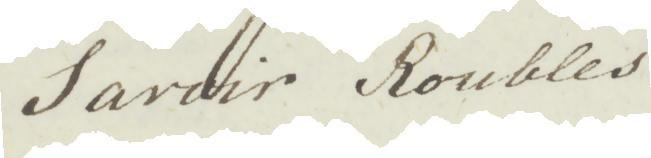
Savoir Roubles
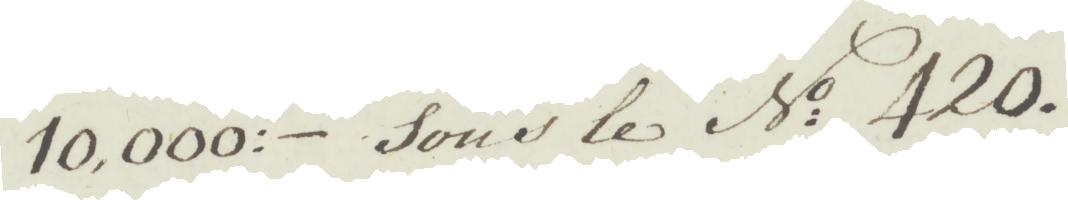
10,000:— sous le N:o 420.
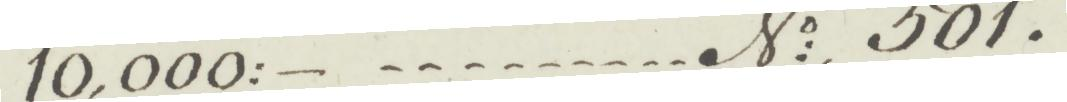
10,000:— - - - - - - - - - N:o 501.
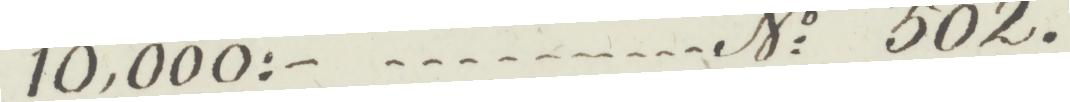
10,000:— - - - - - - - - - - N:o 502.
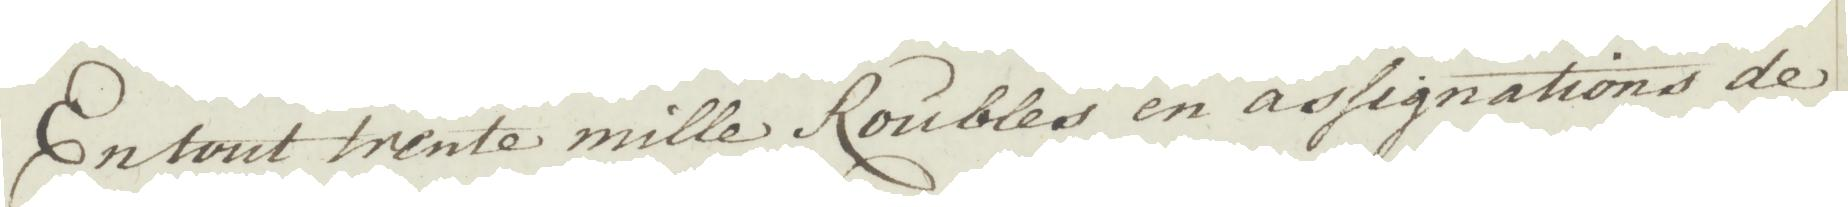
En tout trente mille Roubles en assignations de
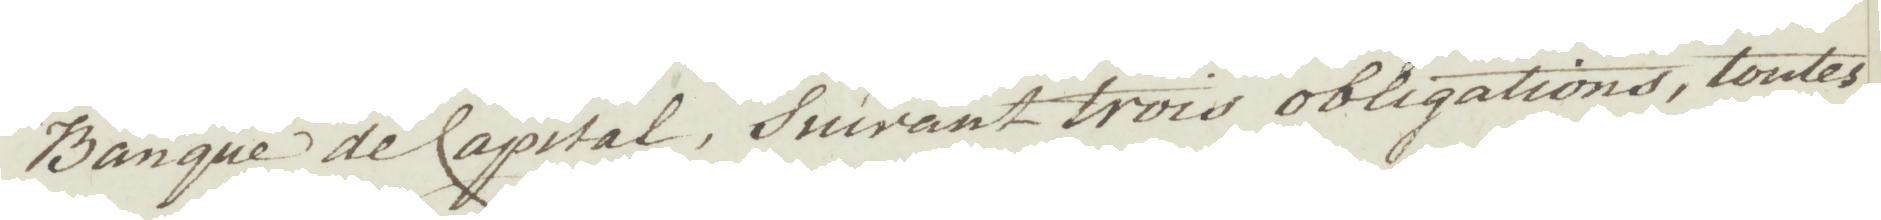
Banque de Capital, Suivant trois obligations, toutes
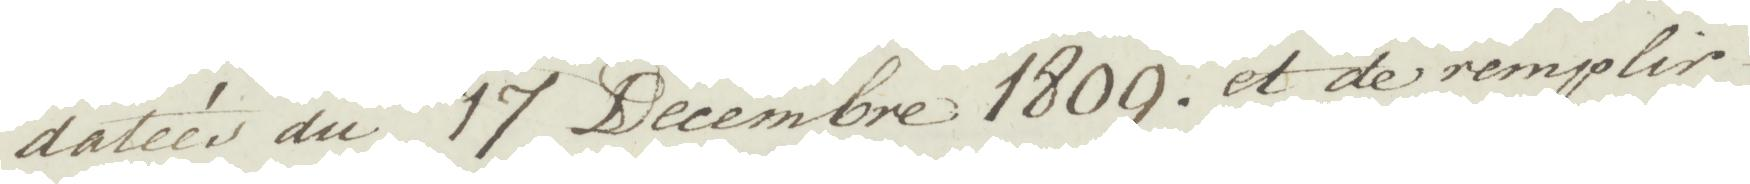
dateés du 17 Decembre 1809. et de remplir
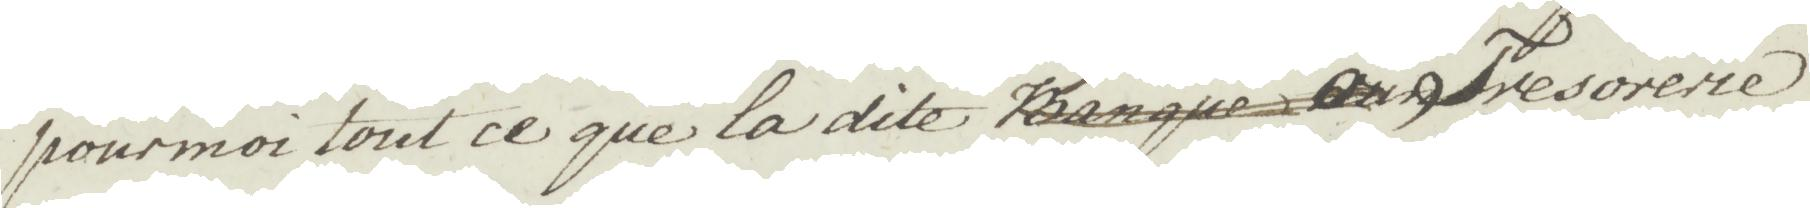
pour moi tout ce que la dite Banque ou Tresorerie
